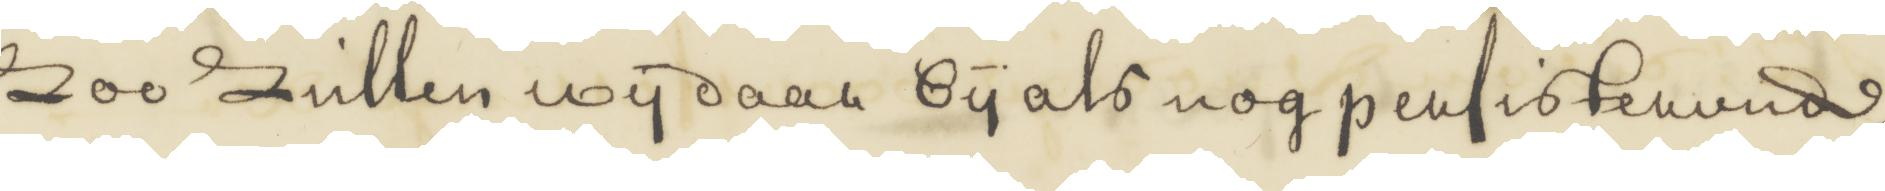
zoo zullen wij daar bij als nog persisterende,
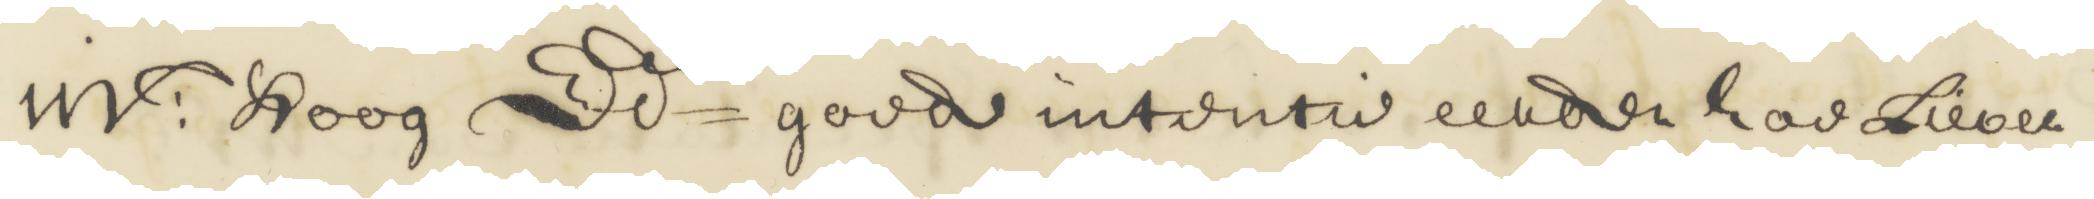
UE: Hoog Ed=ns goede intentie eerder hoe liever
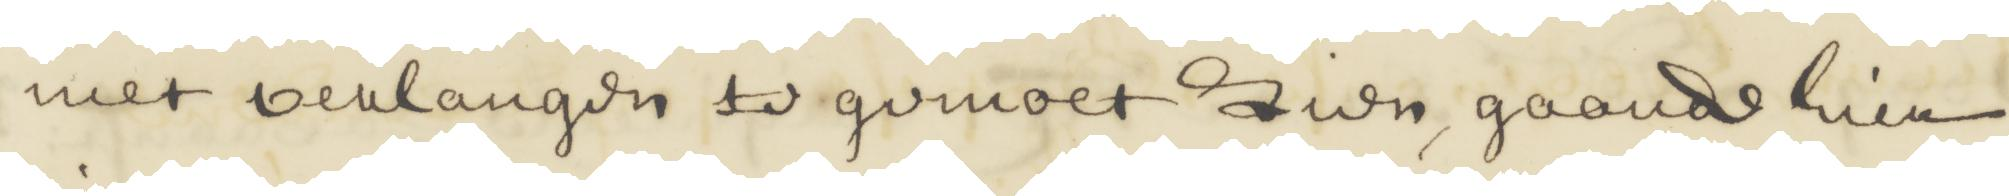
met verlangen te gemoet zien, gaande hier
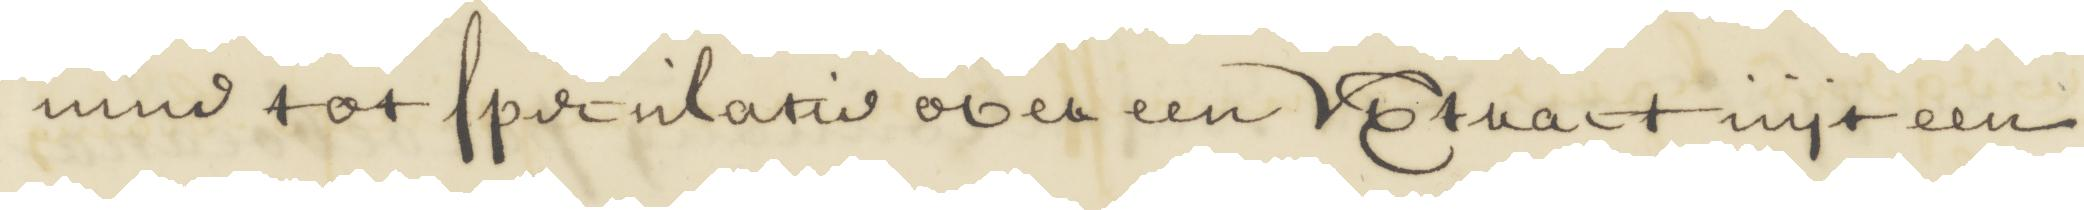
inne tot speculatie over een Extract uijt een
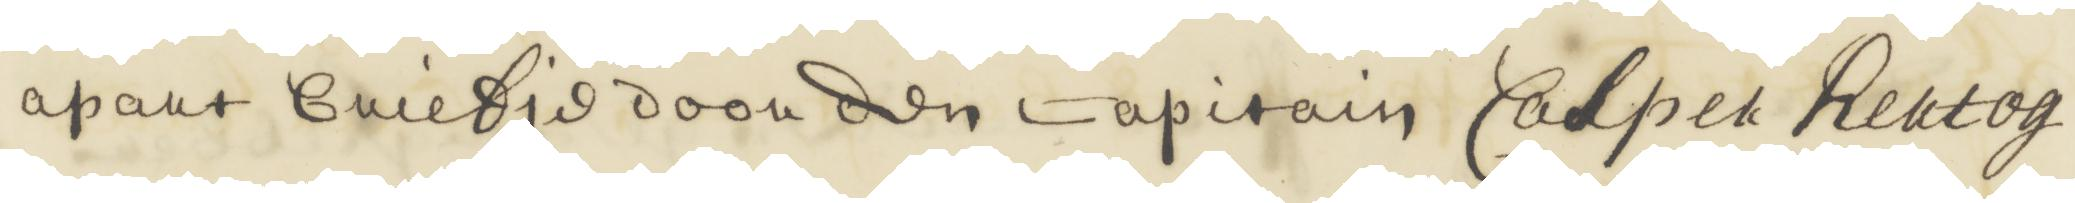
apart briefje door den capitain Casper Hertog
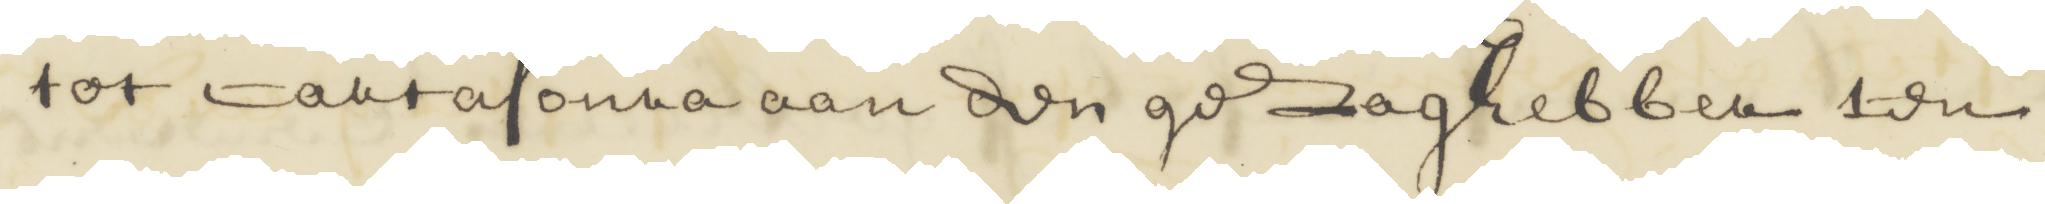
tot cartasoura aan den gezaghebber ten
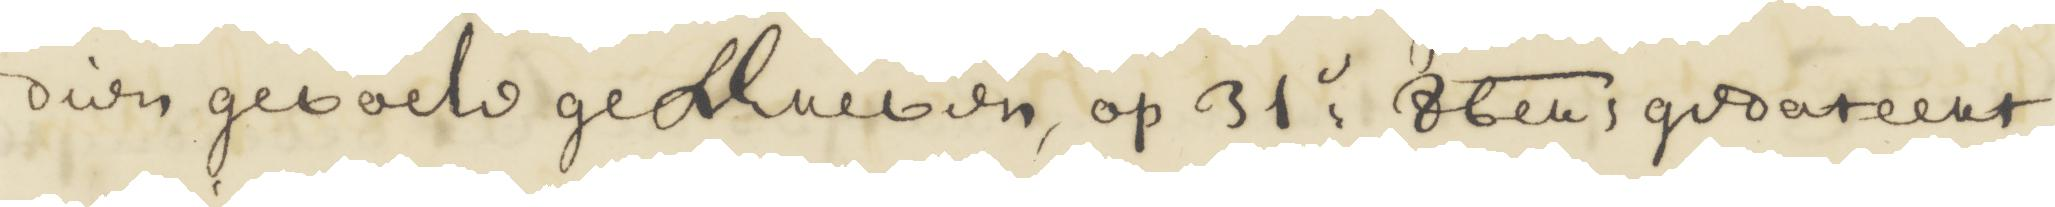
dien gevoele geschreven, op 31:' 8ber: gedateert,
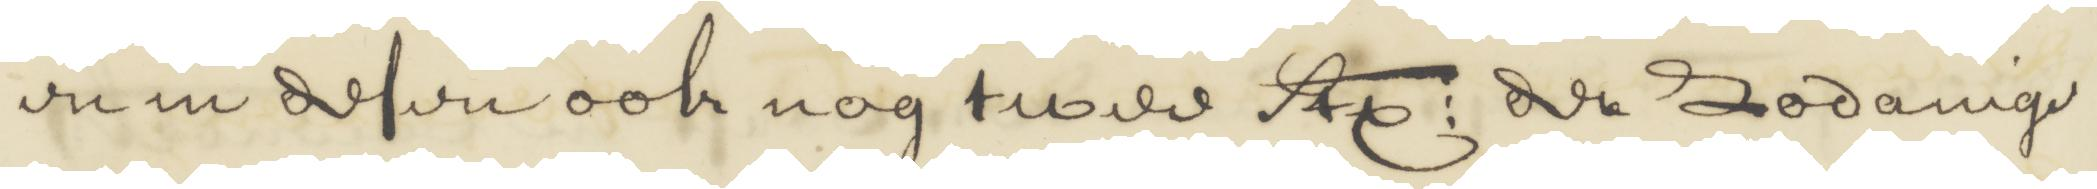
en in desen ook nog twee stx: der zodanige
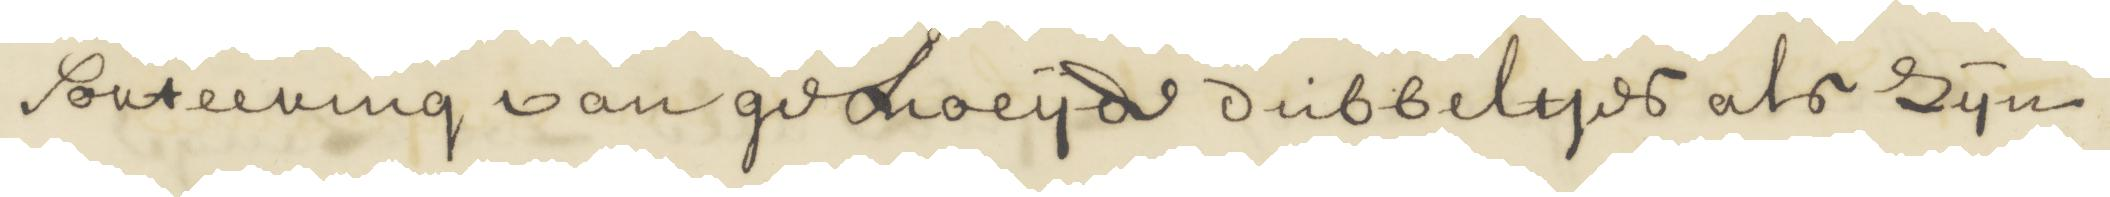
sorteering van gesnoeijde dubbeltjes als zijn
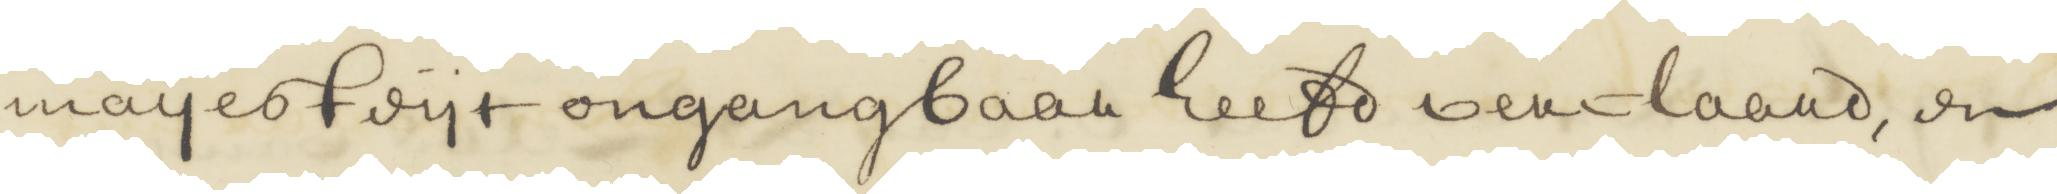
maijesteijt ongangbaar heefd verclaard, en
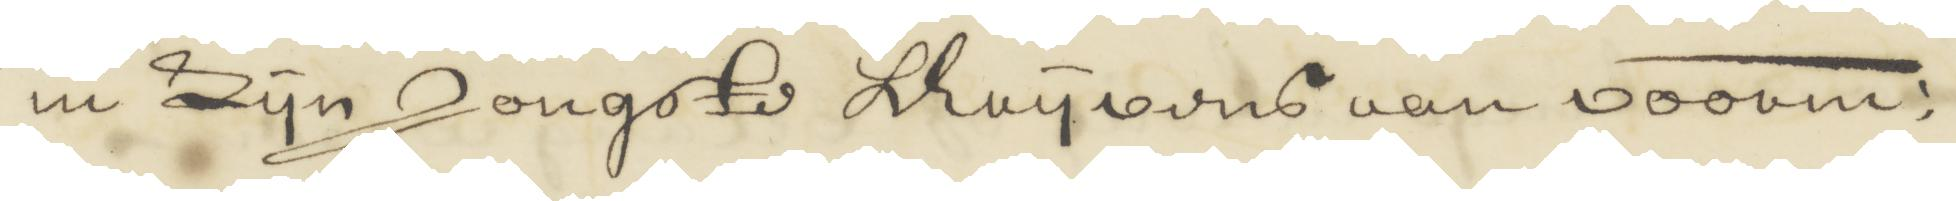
in zijn Jongste schrijvens aan voorm:
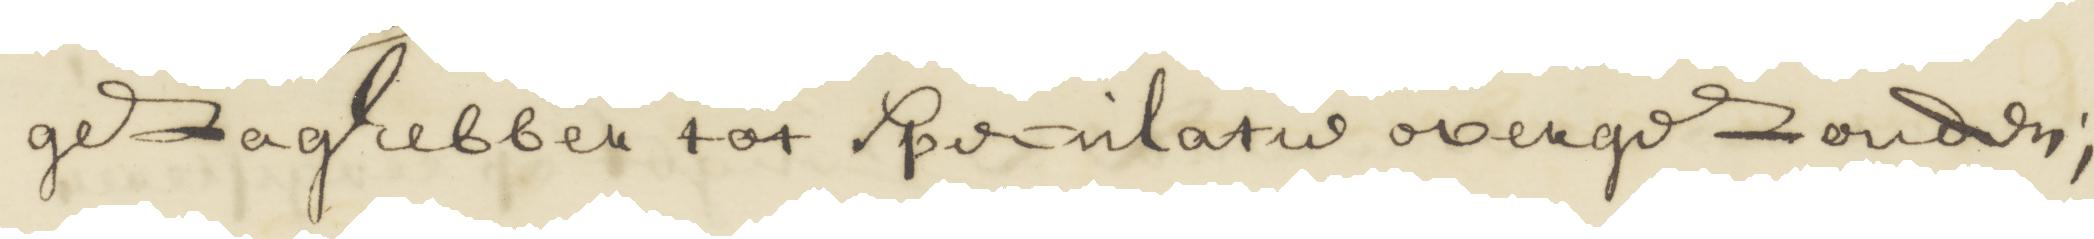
gezaghebber tot speculatie overgezonden;
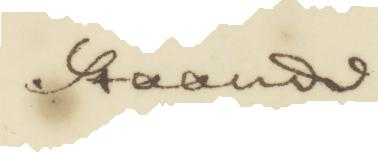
staande
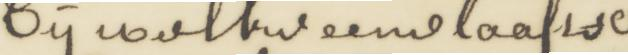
bij welke eene laasts
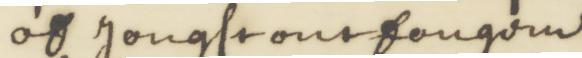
of Jongst ontfongene
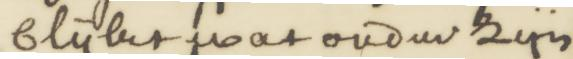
blijkt wat ordre zijn
